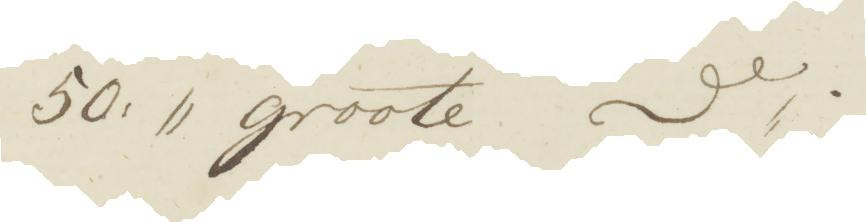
50. „ groote d„o.
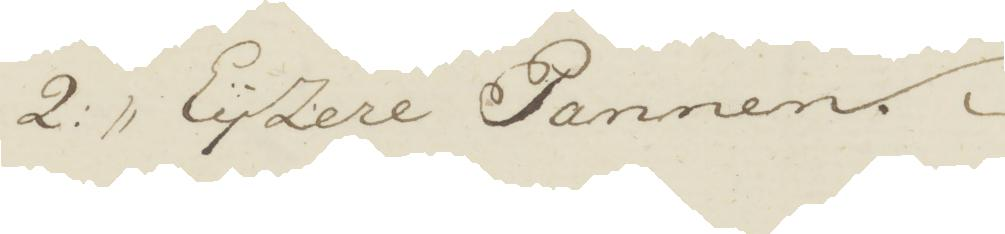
2: „ Eijzere Pannen.—
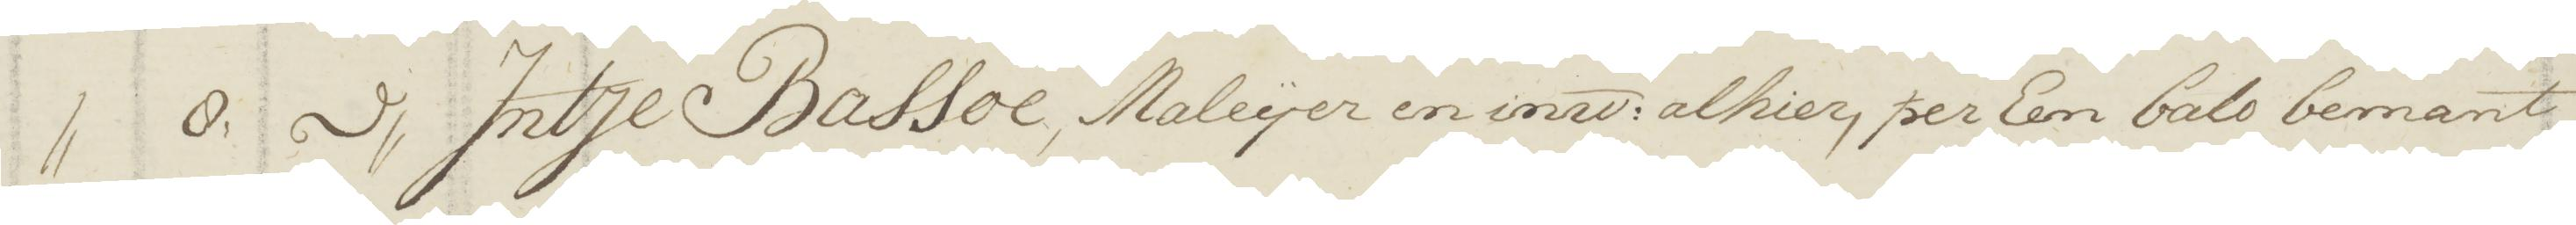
„ 8: d„o Intje Bassoe, Maleijer en inw: alhier, per Een balo bemant
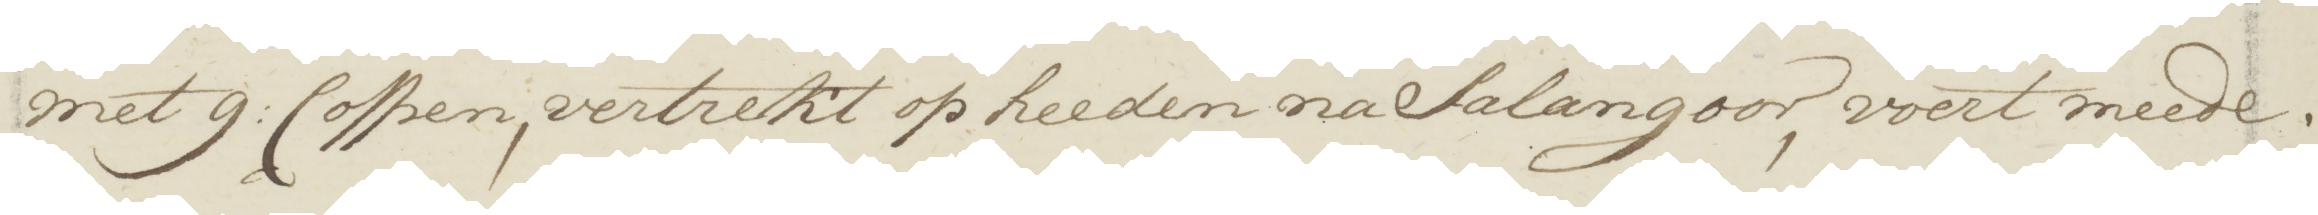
met 9: Coppen, vertrekt op heeden na Salangoor, voert meede.
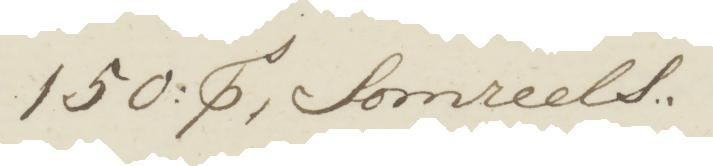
150: p„s Somreels..
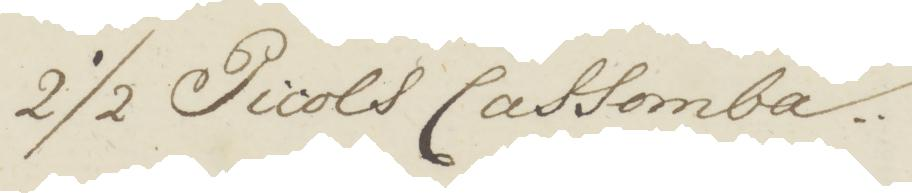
2½ Picols Cassomba..
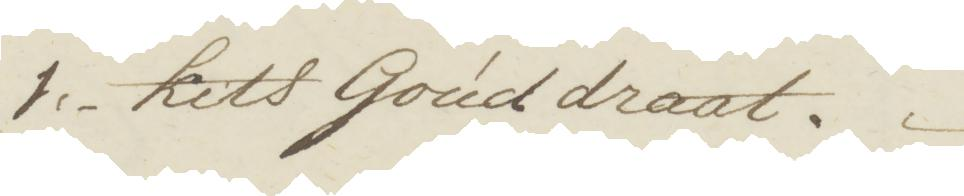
1._ kits Goud draat.—
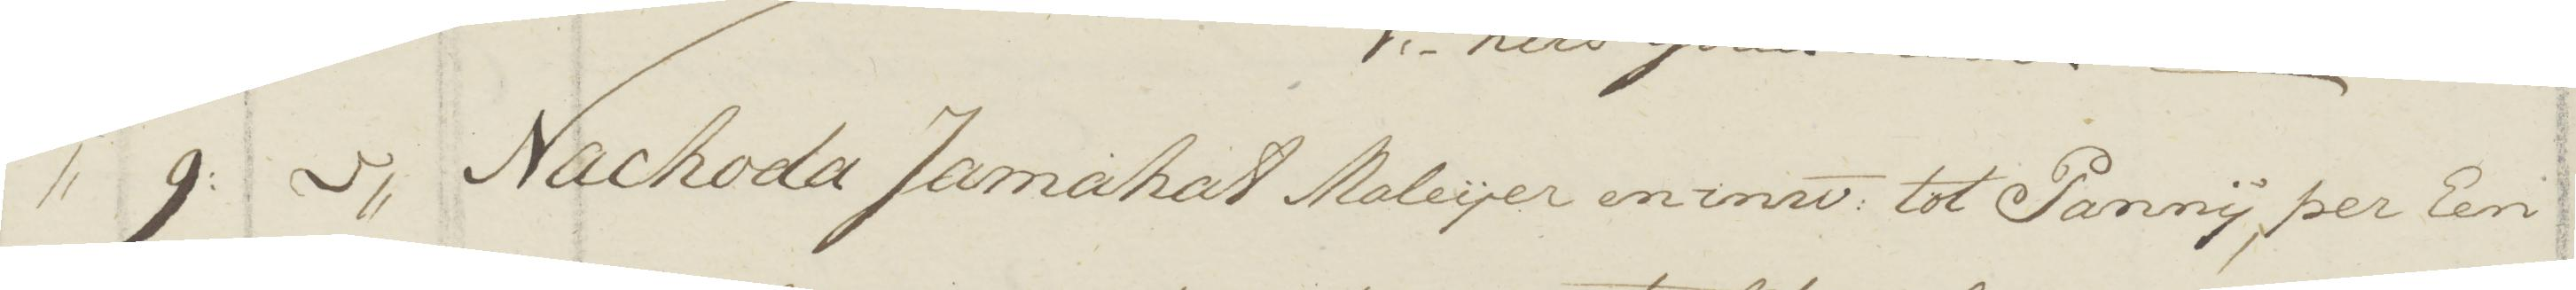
„ 9: d„' Nachoda Jamahat Maleijer en inw: tot Pannij, per Een
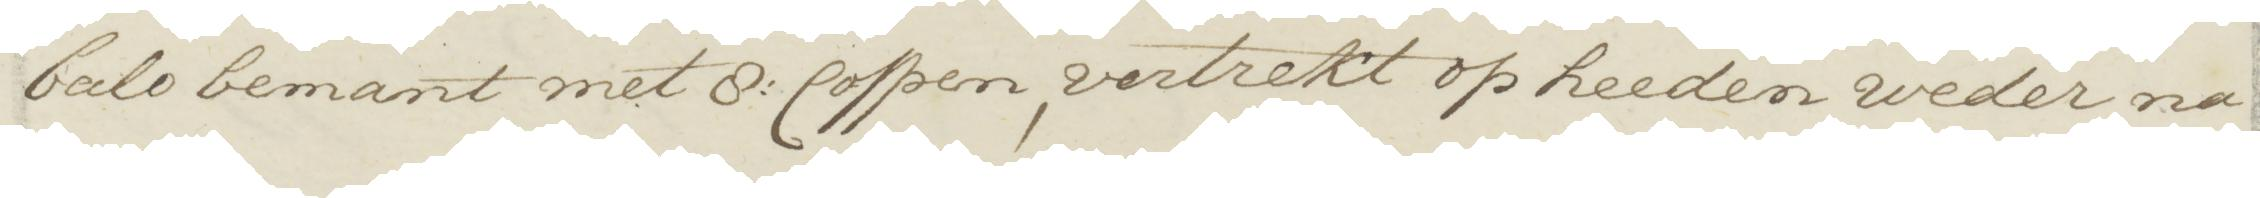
balo bemant met 8: Coppen, vertrekt op heeden weder na
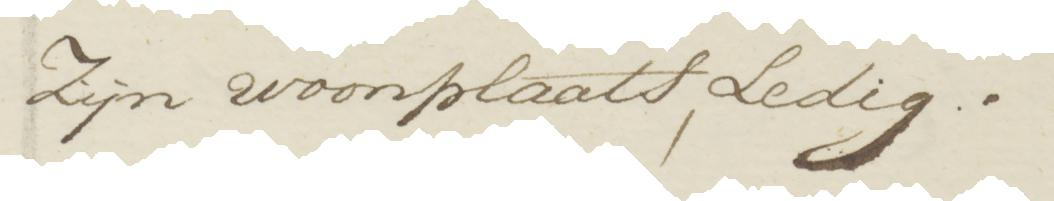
zijn woonplaats, ledig..
